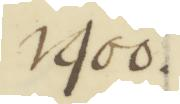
1400.
